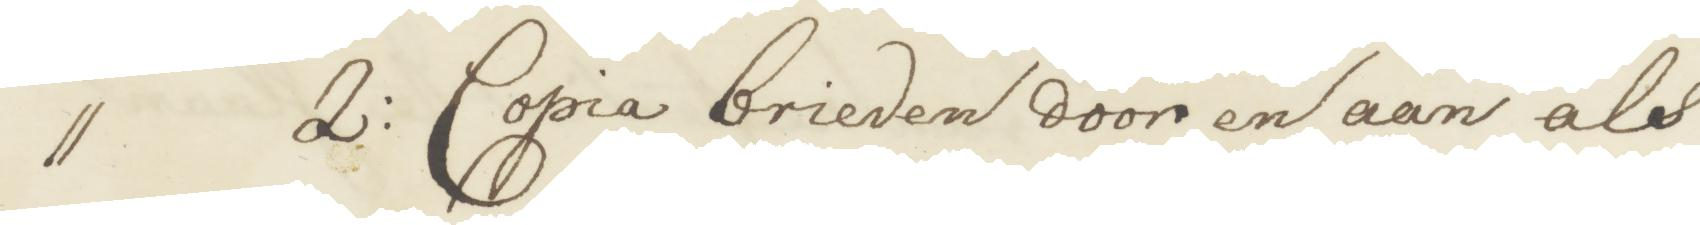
„ 2: Copia brieven door en aan als
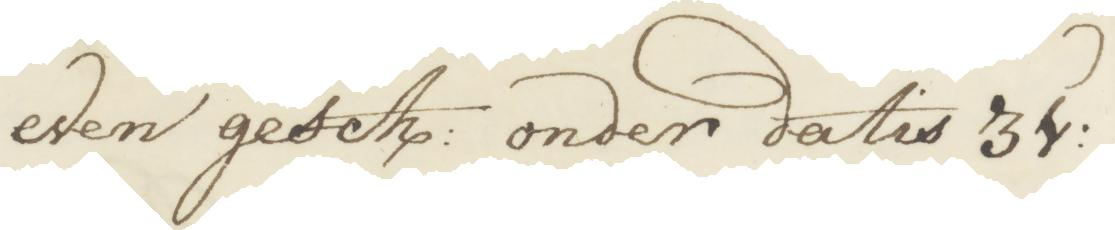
even gesch: onder datis 31:'
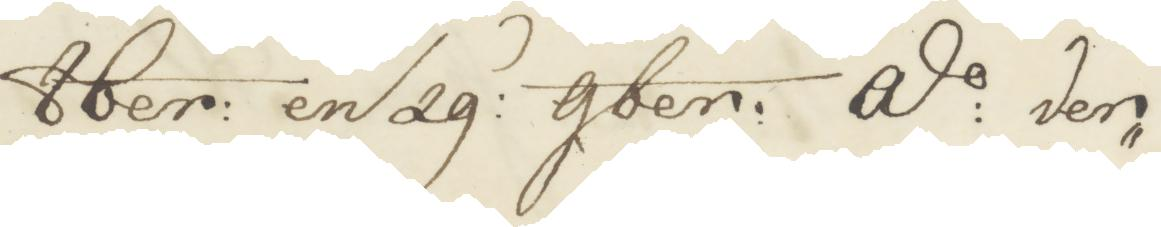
8ber: en 29:' gber: a:o ver„
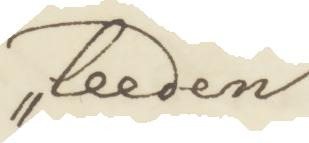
„leeden
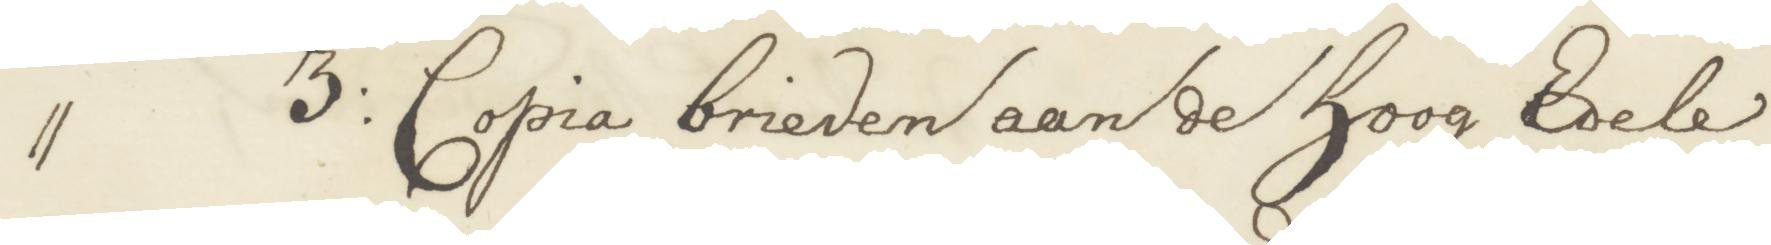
„ 3: Copia brieven aan de hoog Edele
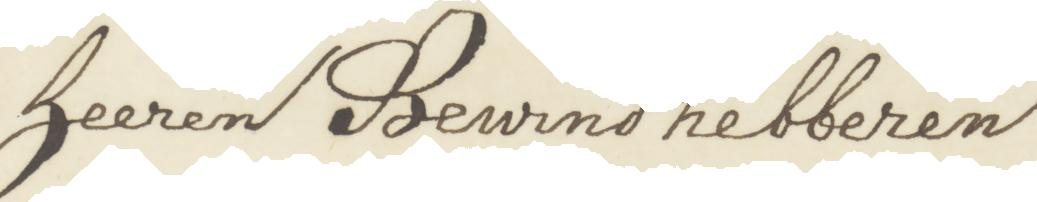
heeren Bewind hebberen
